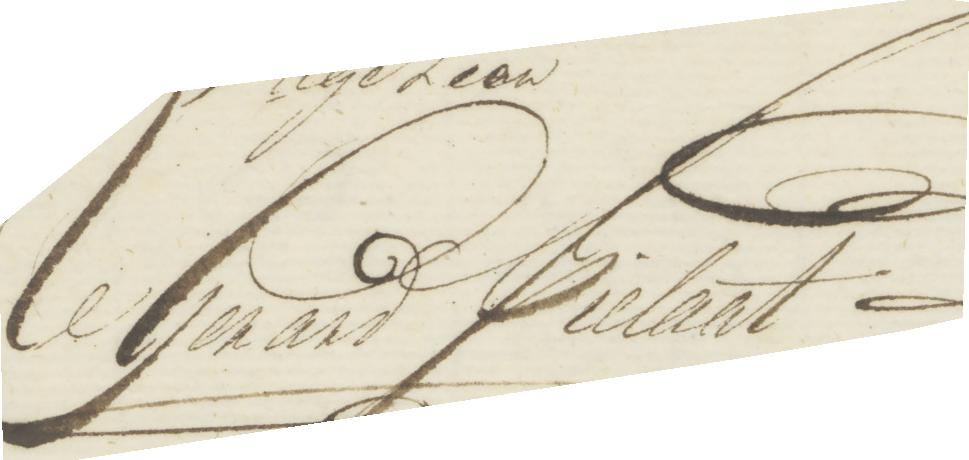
te Gerard Pielaat
